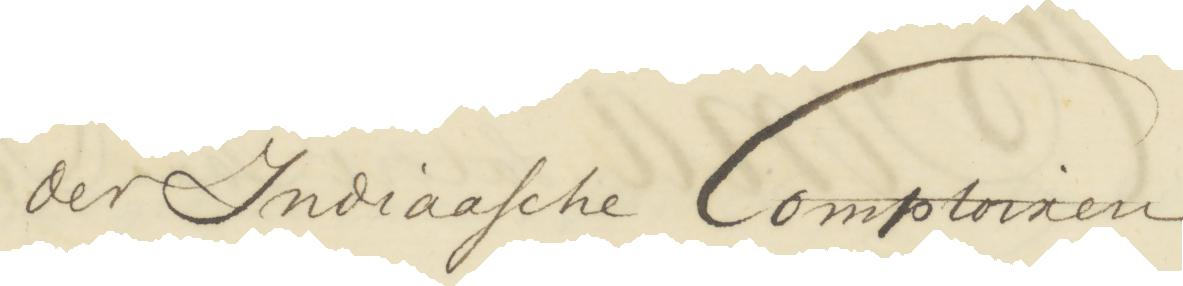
der Indiaasche Comptoiren
